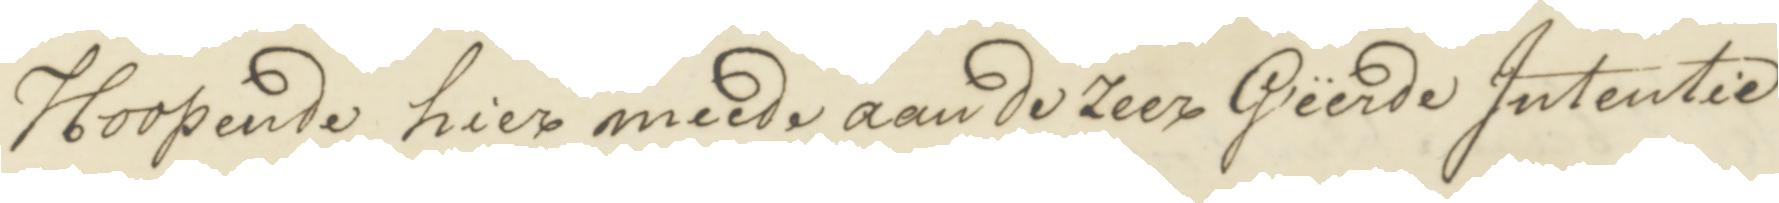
Hoopende hier meede aan de zeer G'ëerde Jntentie
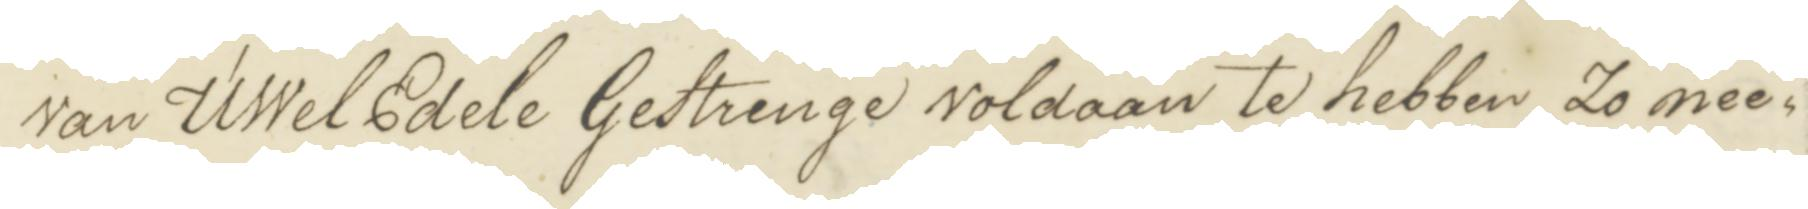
van Uwel Edele Gestrenge voldaan te hebben, zo nee„
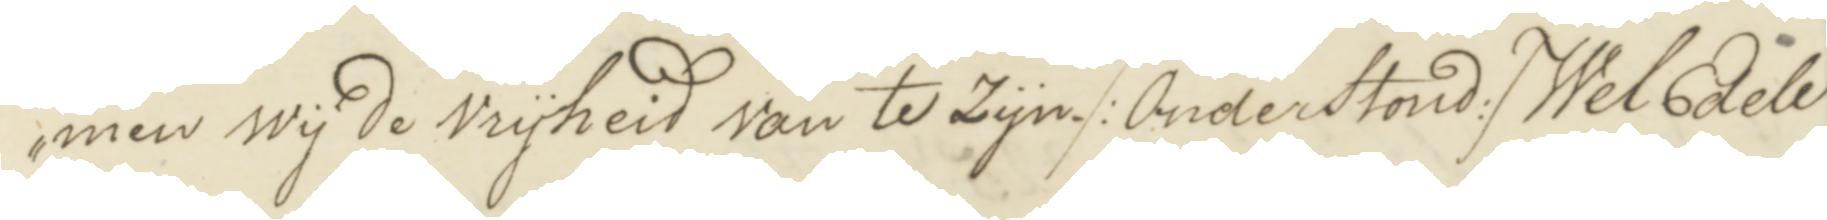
„men wij de vrijheid van te zijn. /:Onderstond:/ Wel Edele
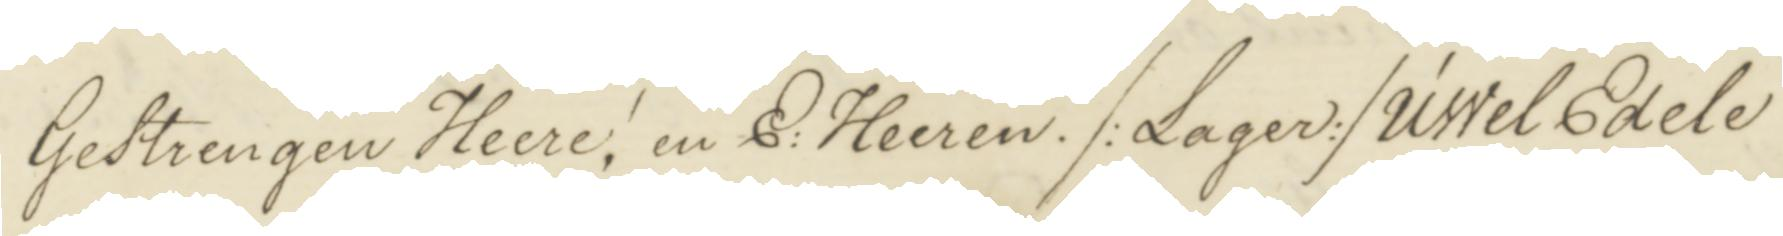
Gestrengen Heere! en E: Heeren! /:Lager:/ Uwel Edele
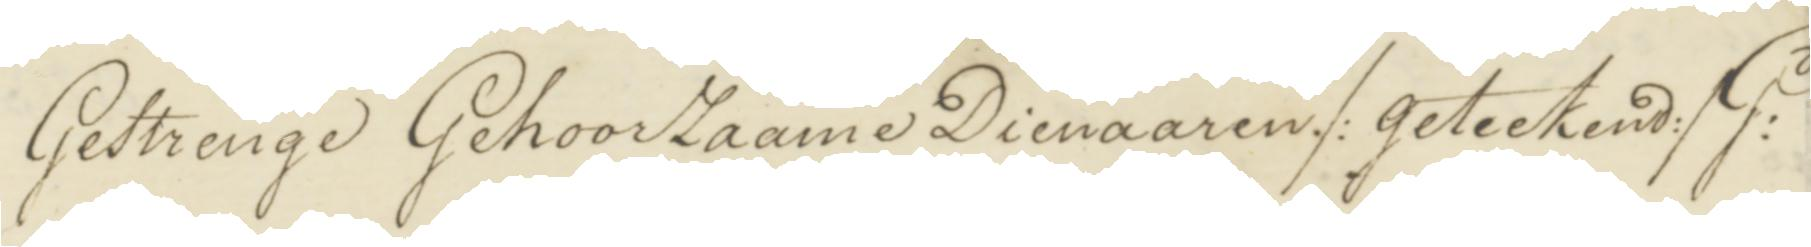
Gestrenge Gehoorzaame Dienaaren. /:geteekend:/ G:'
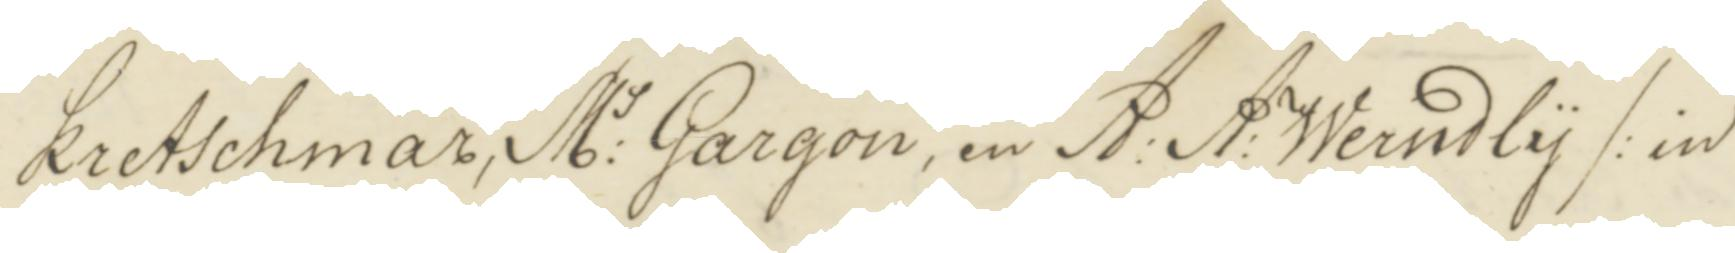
kretschmar, M:s Gargon, en A: A:' Werndlij /:in
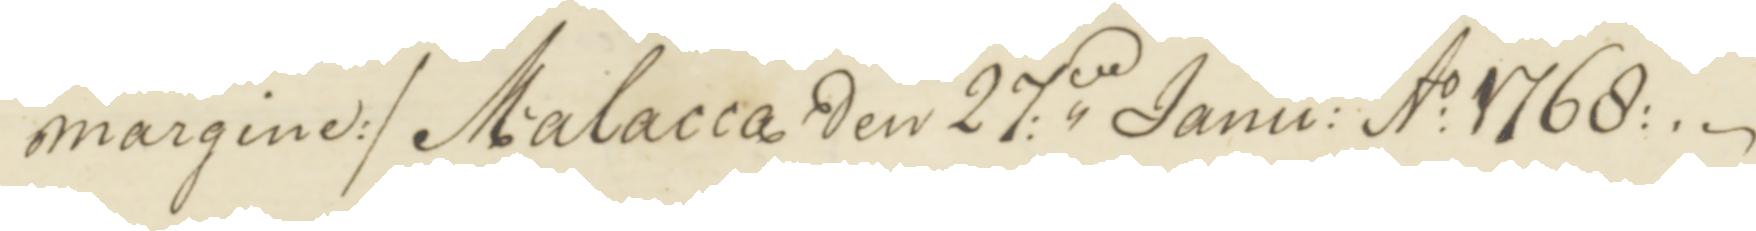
margine:/ Malacca den 27:„e Janu: A:o 1768:.
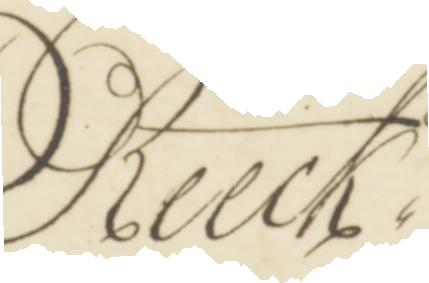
Reeck„e
